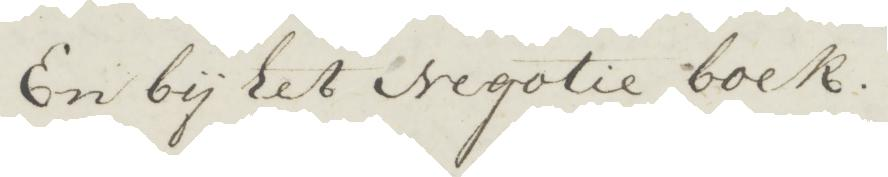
En bij het Negotie boek.
